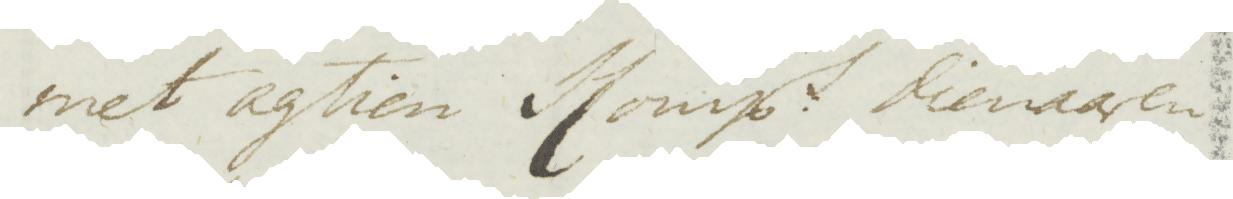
met agtien s Comp:s dienaaren
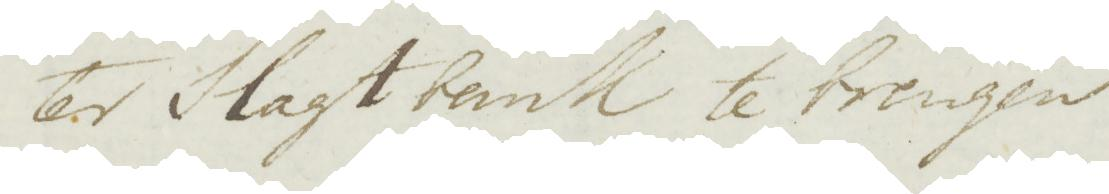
ter slagt bank te brengen
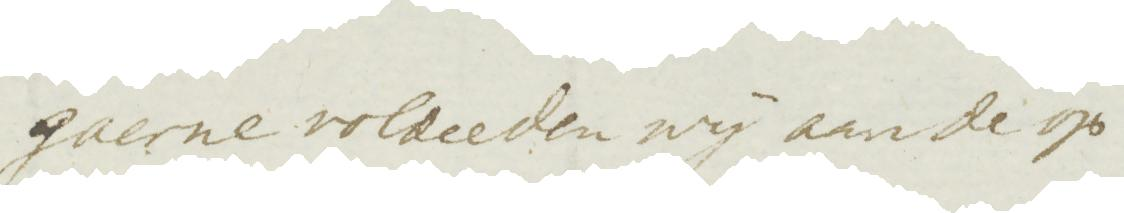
gaerne voldeeden wij aan de op
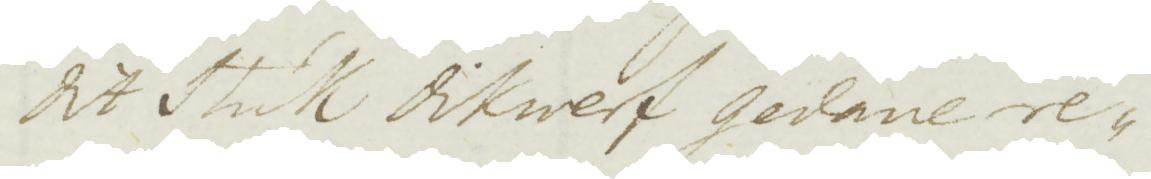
dit stuk dikwerf gedane re„
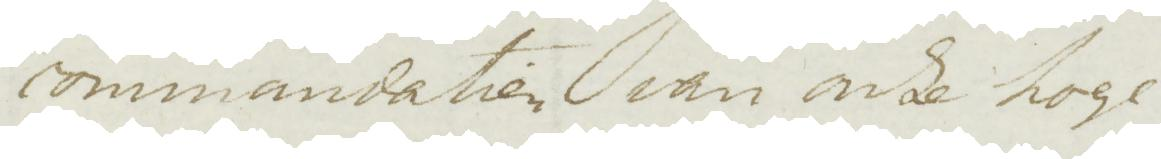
commandatien van onze hoge
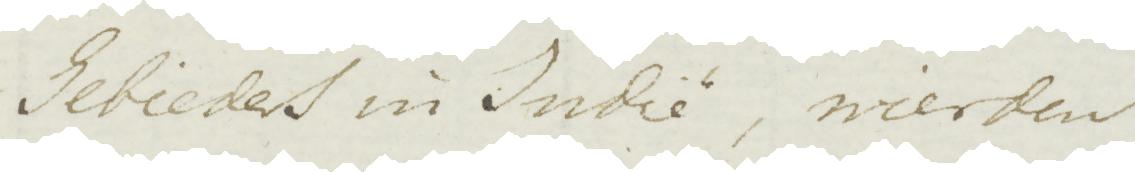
Gebieders in Indië, wierden
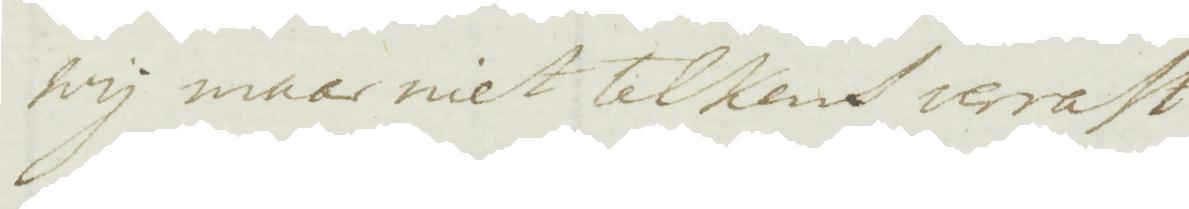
wij maar niet telkens verrast
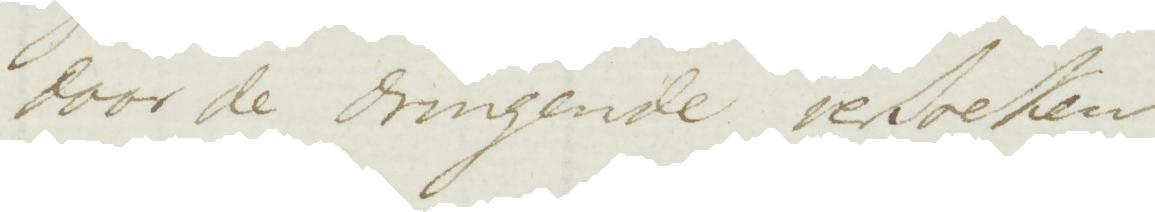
door de dringende versoeken
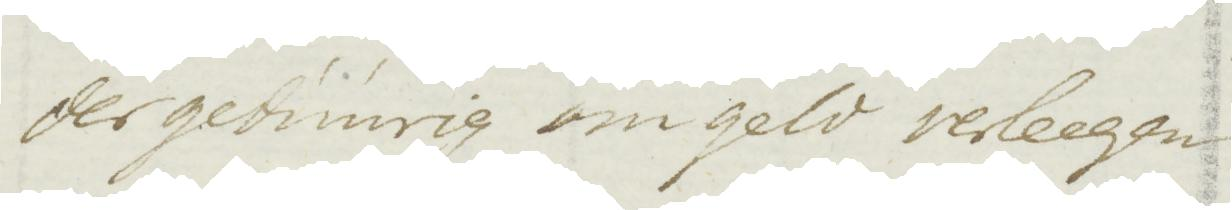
der geduurig om geld verleegen
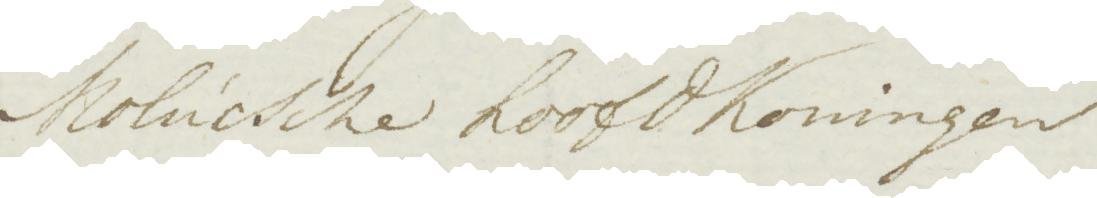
Molucsche hoofd koningen
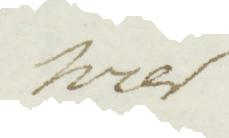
wier
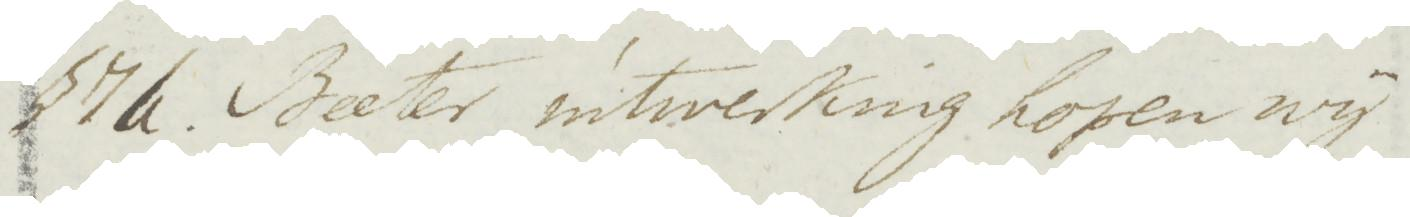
§74. Beeter uitwerking hopen wij
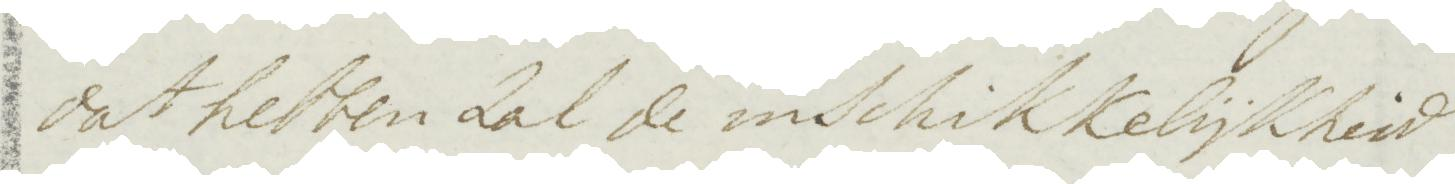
dat hebben zal de inschikkelijkheid,
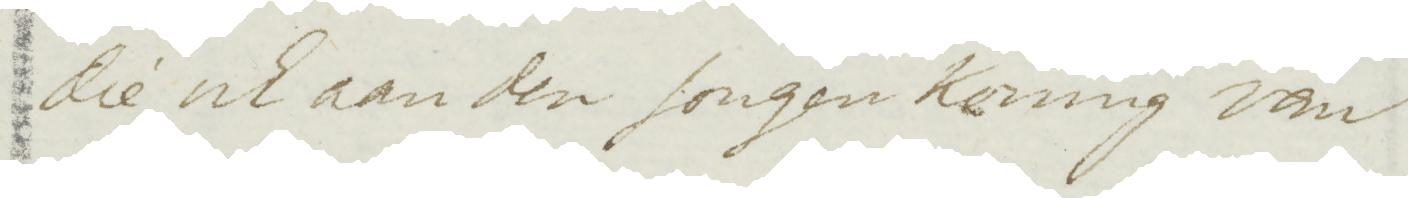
die uE aan den jongen koning van
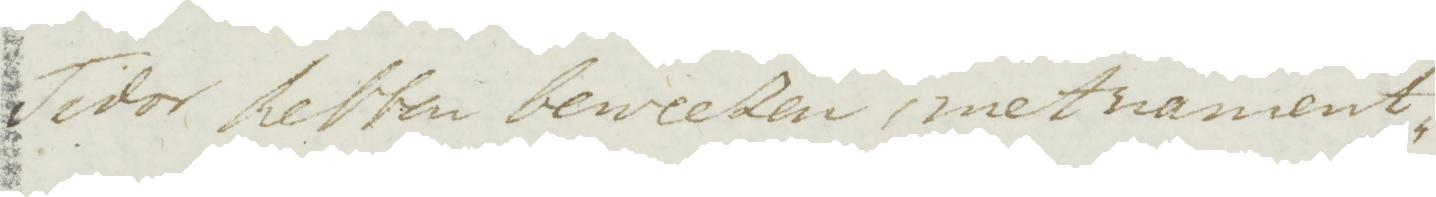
Tidor hebben beweezen, met nament
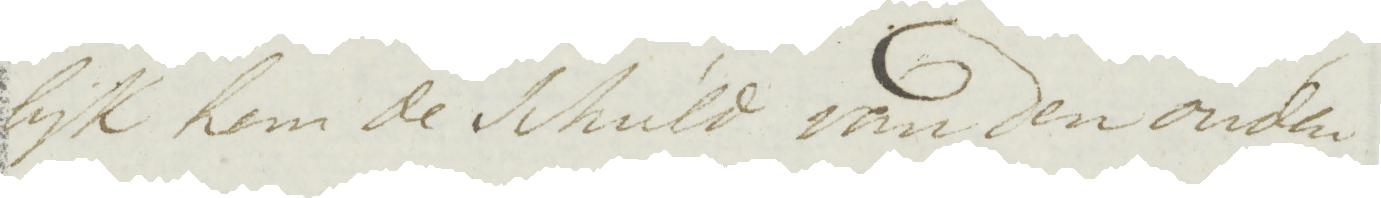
lijk hem de schuld van den ouden
